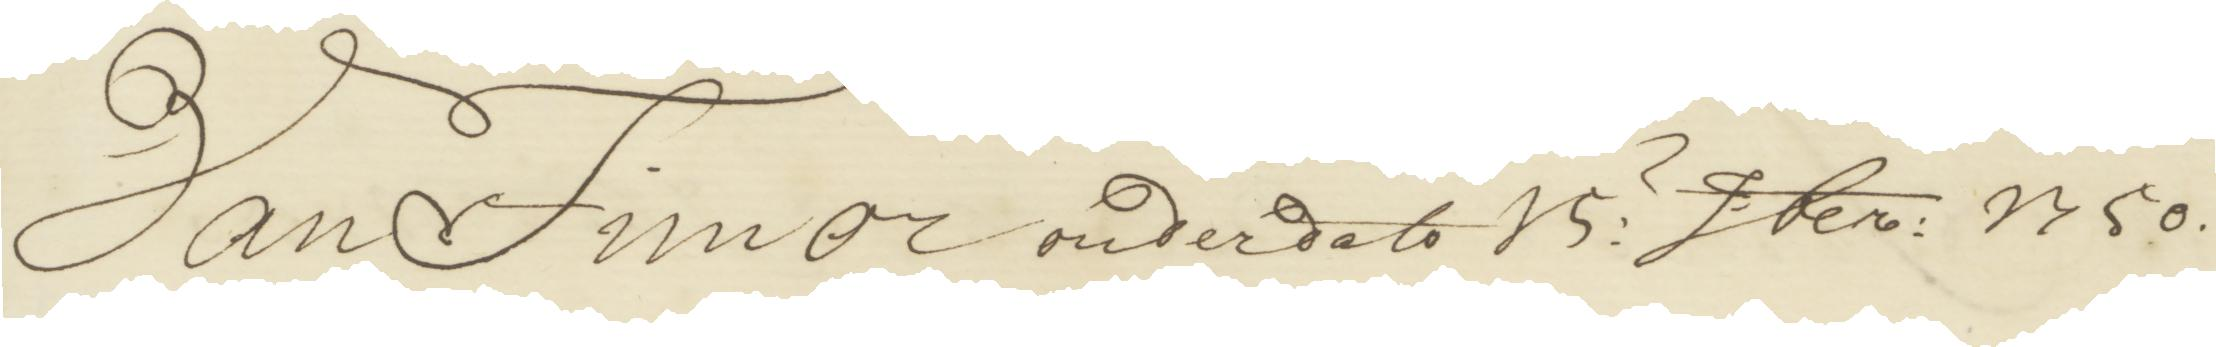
Van Timor onder dato 15:' Jber: 1750.
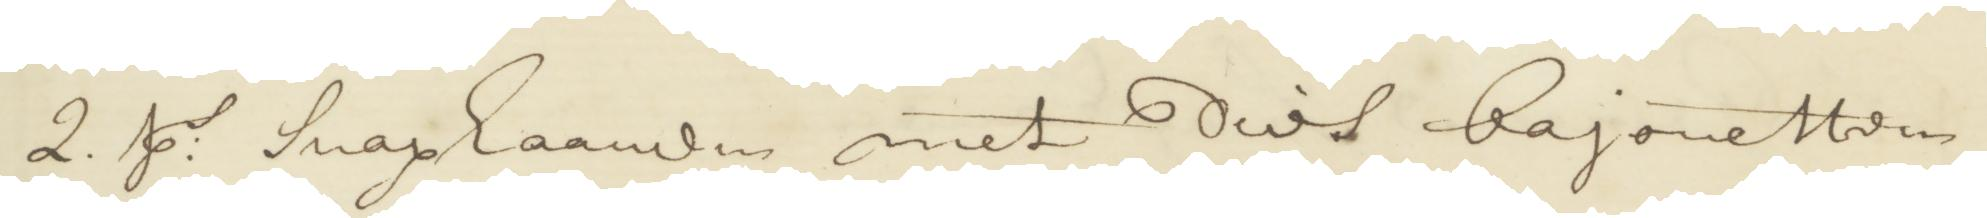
2. p:s snaphaanen met dies bajonetten
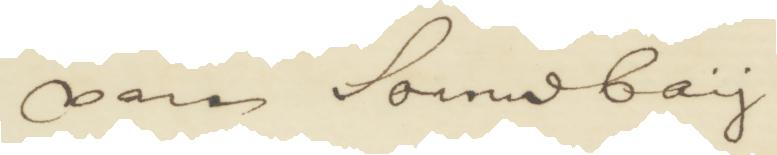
van sonnebaij
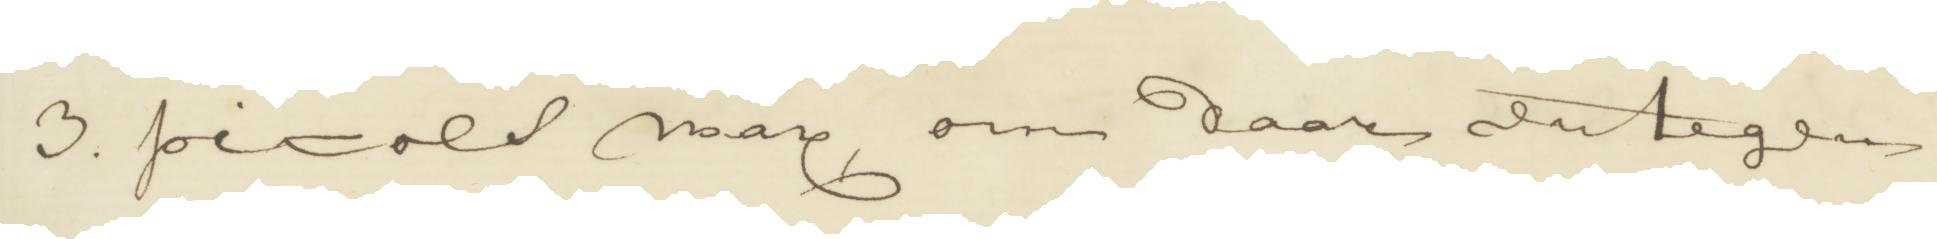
3. picols wax, om daar en tegen
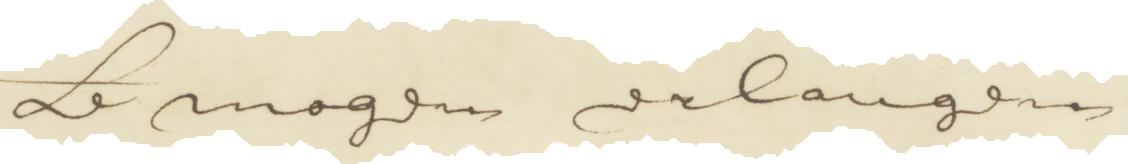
te mogen erlangen
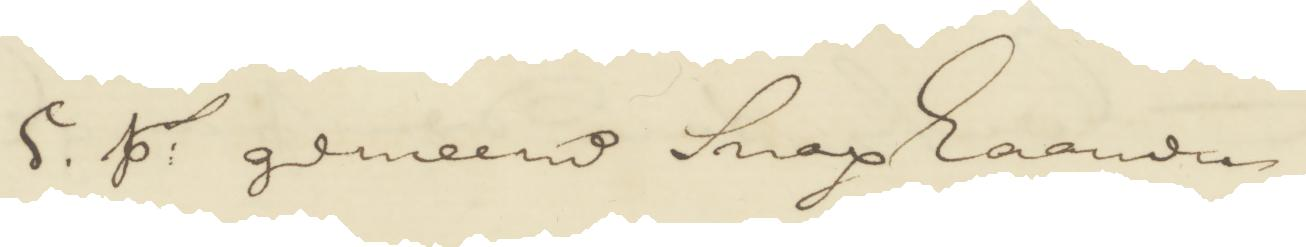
5. p:s gemeene snaphaanen
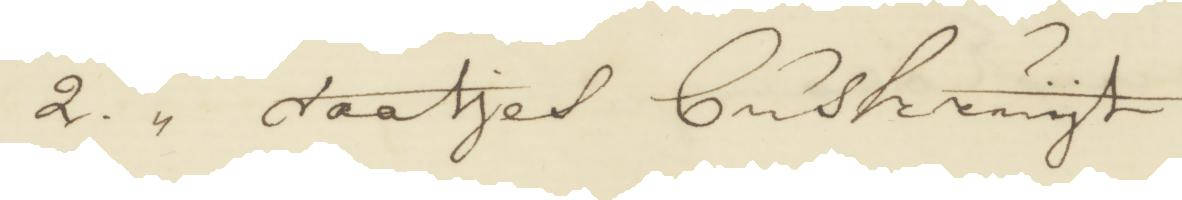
2. „ vaatjes buskruijt
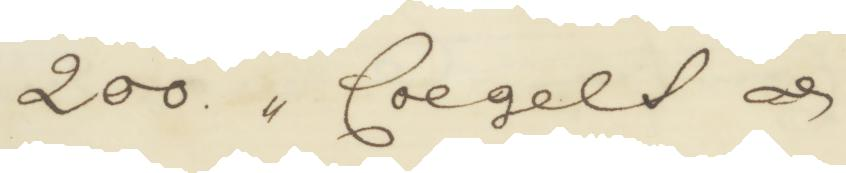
200. „ Coegels en
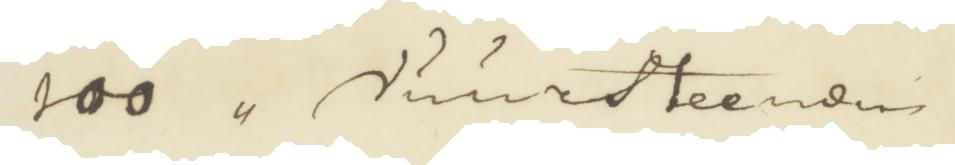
100 „ vuursteenen
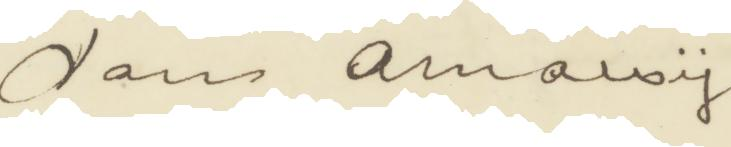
van amawij
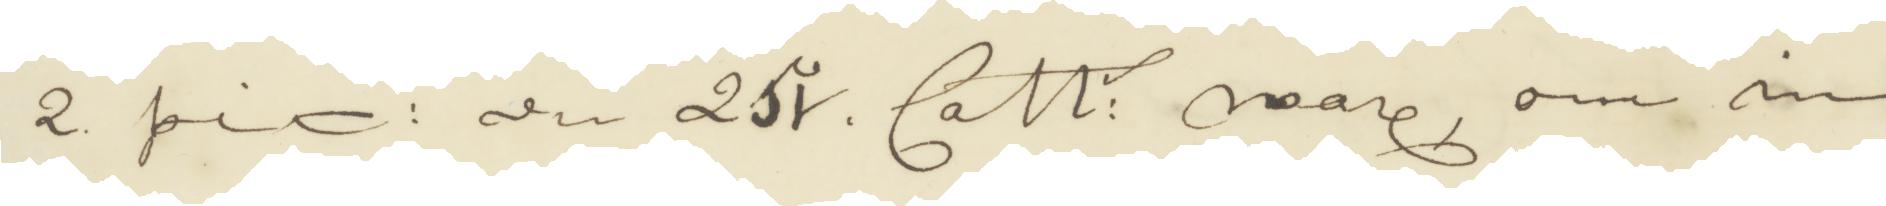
2. pic:s en 251. Catt:s wax, om in
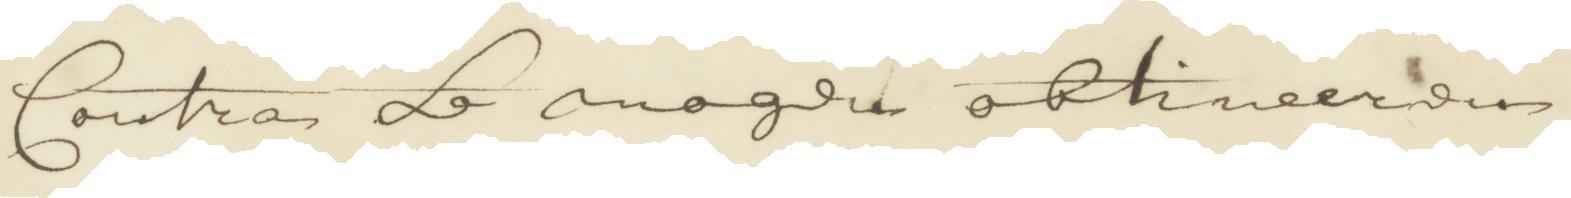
Contra te mogen obtineeren
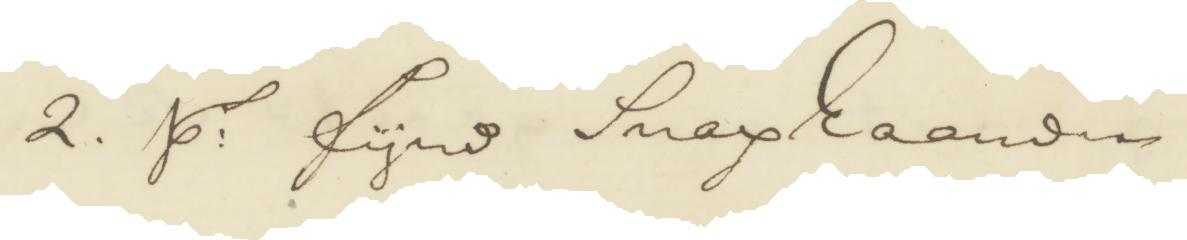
2. p:s fijne snaphaanen
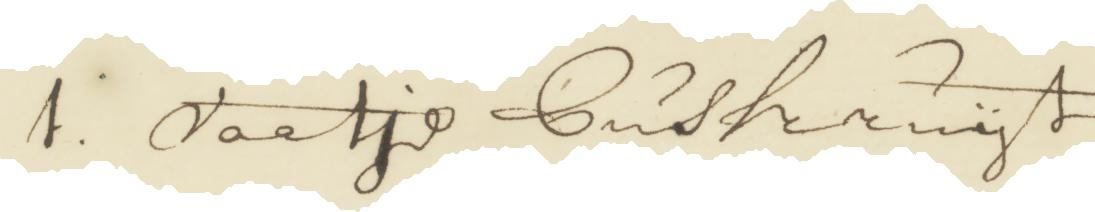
1. vaatje buskruijt
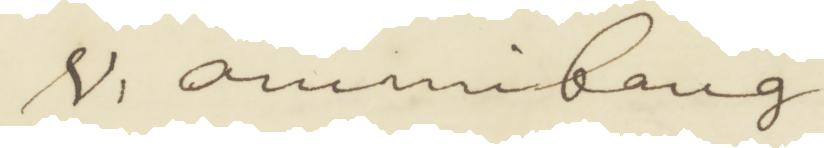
v. ommibang
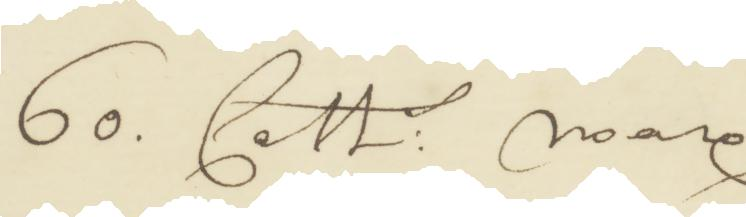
60. Catt:s wax
